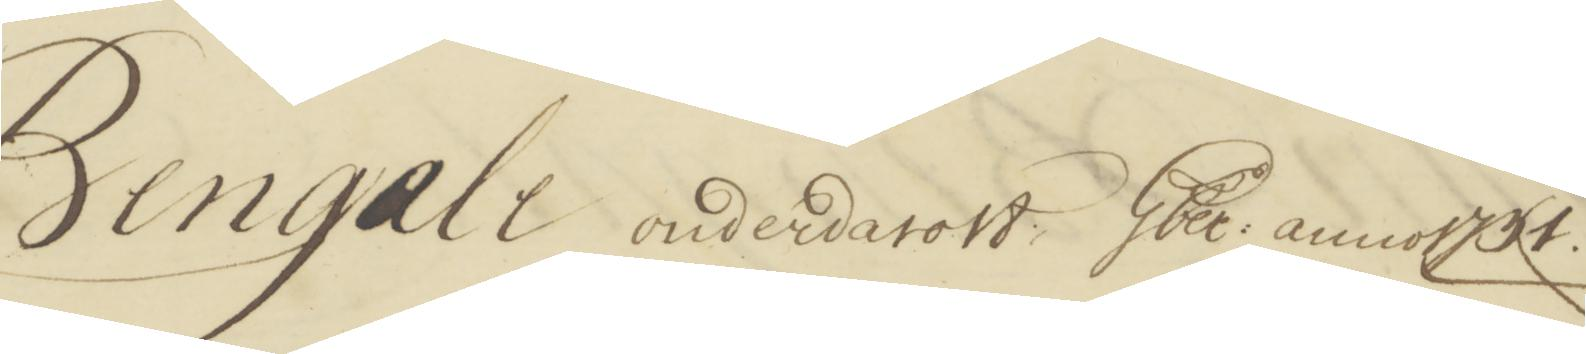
Van Bengale onder dato 18: 9ber: anno 1731.
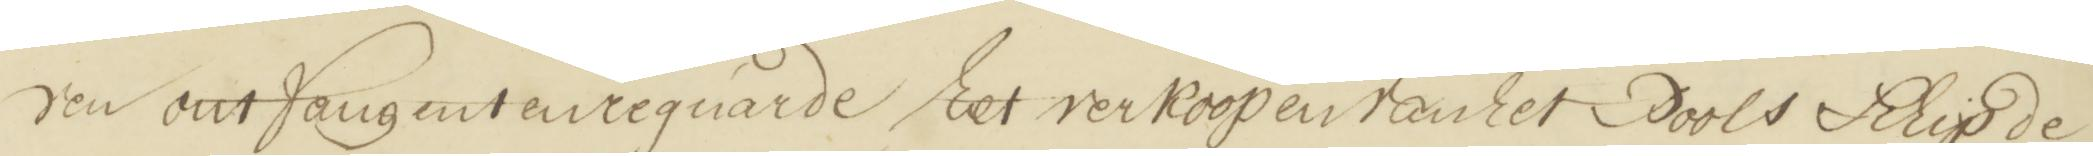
ven ontfangen ten reguarde het verkoopen van het Pools schip de
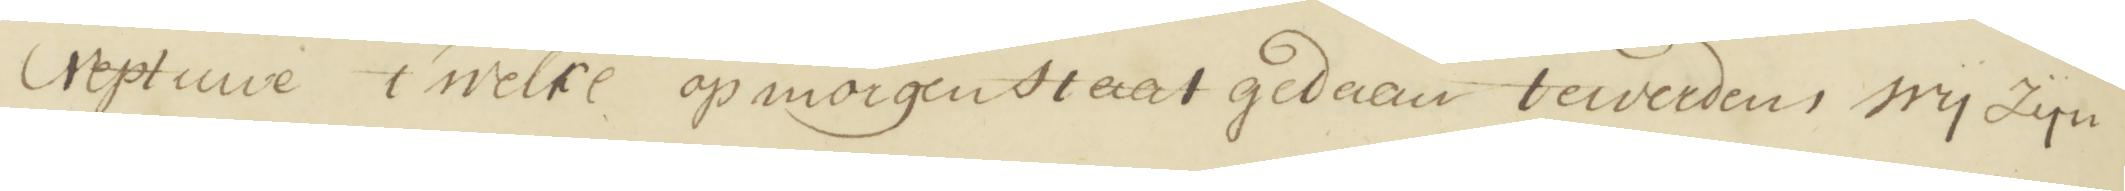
Neptune 't' welke op morgen staat gedaan te werden wij Zijn
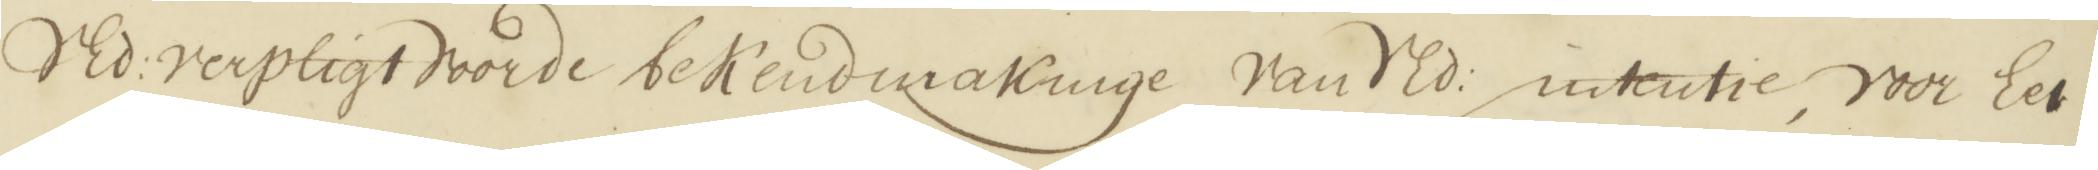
VEd: verpligt voor de bekendmakinge van UEd: intentie voor het
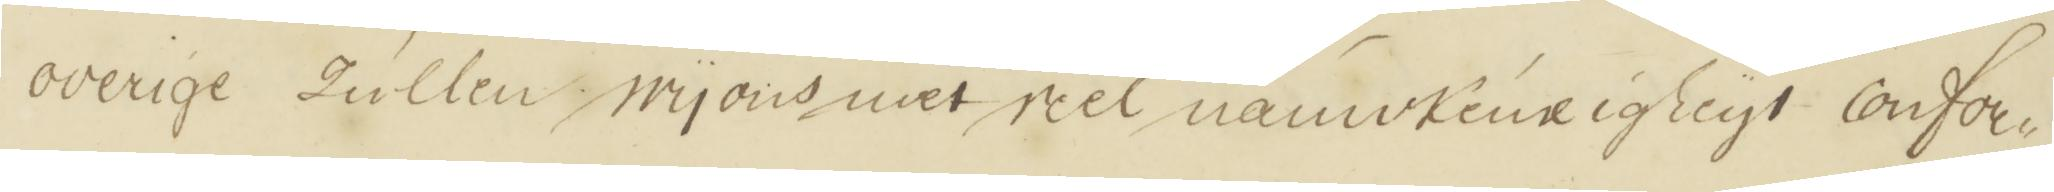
overige zullen wij ons met veel nauwkeurigheijt confor„
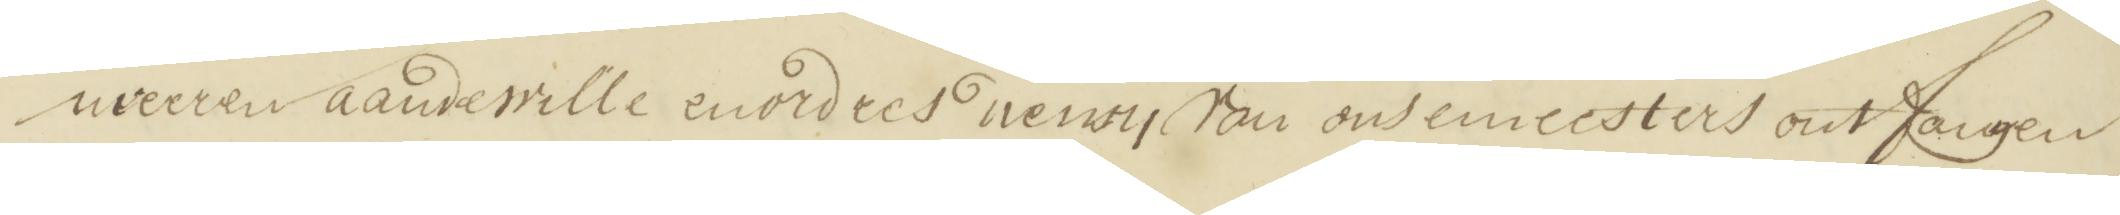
meeren aan de wille en ordres die wij Van onse meesters ontfangen
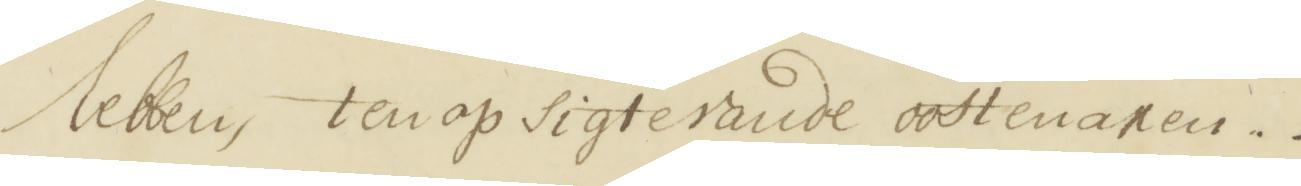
hebben, ten op sigte vande oostenaren„
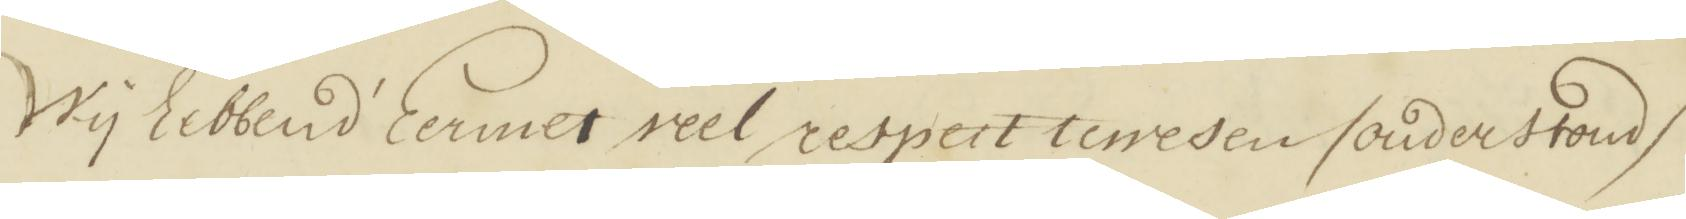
Wij hebben d'Eer met veel respect tewesen /onderstond:/
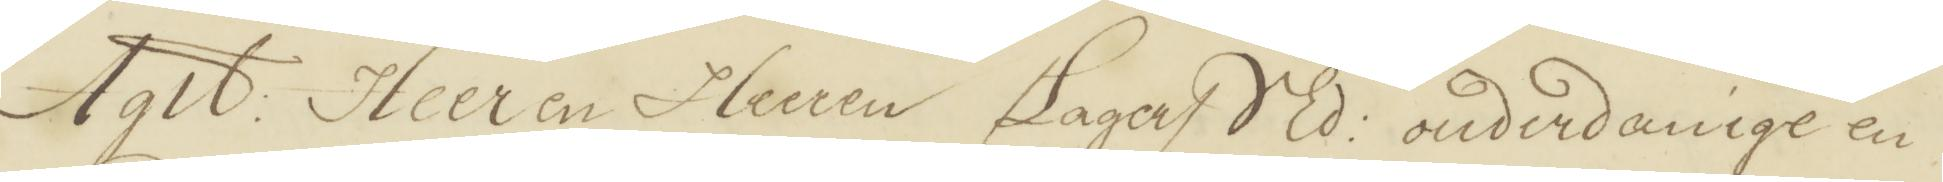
Agtb: Heer en Heeren Lager/ UEd: onderdanige en
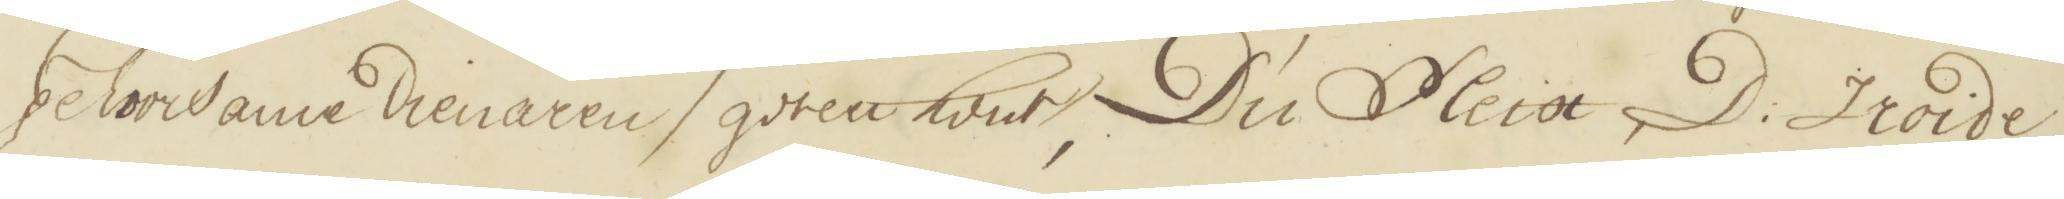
gehoorsame dienaren / geteeckent Du Pleix D: Iroide
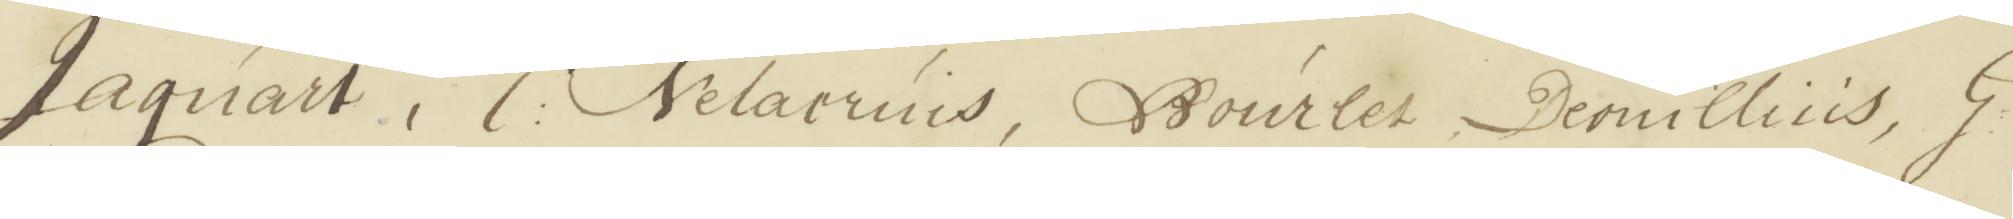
Jaquart. C: Nelacrius, Bourlet, Demillius, G:
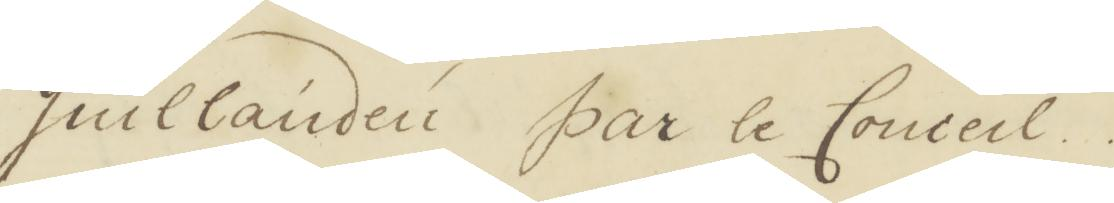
Guillauden par le Conceil. .
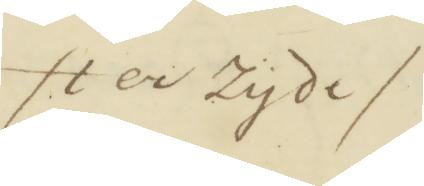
/ ter Zijde/
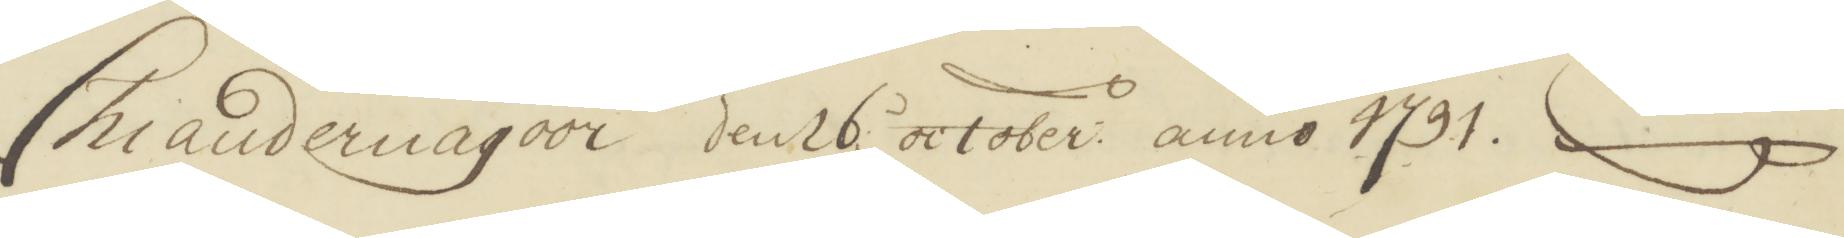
Chiandernagoor den 26:' october: anno 1731.—
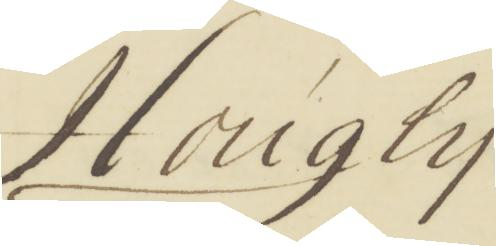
Hougly
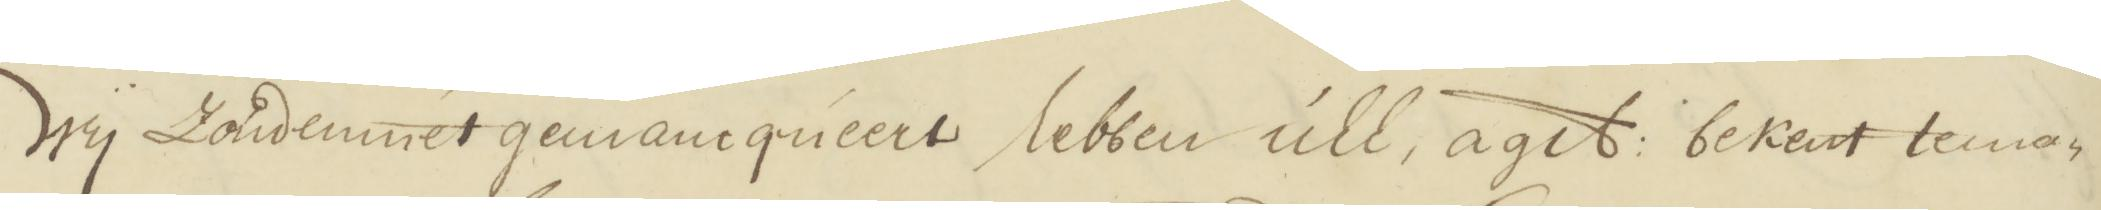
Wij zouden niet gemancqueert hebben uEl, agtb: bekent tema„
